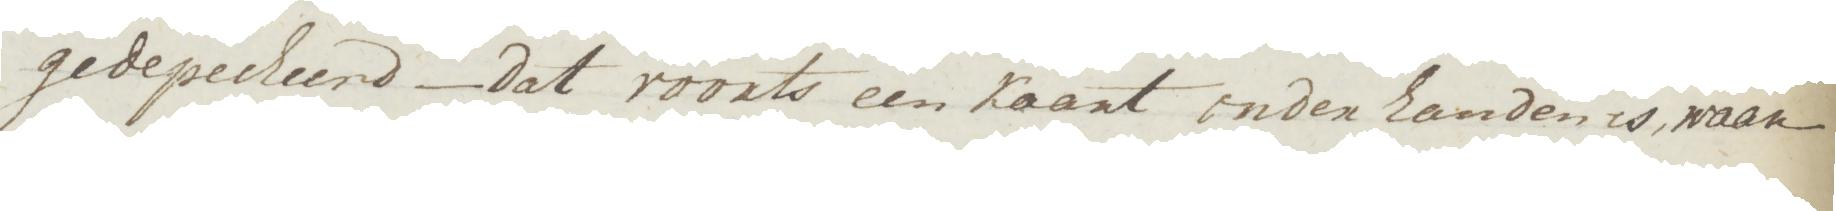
gedepecheerd — dat voorts een kaart onder handen is, waar
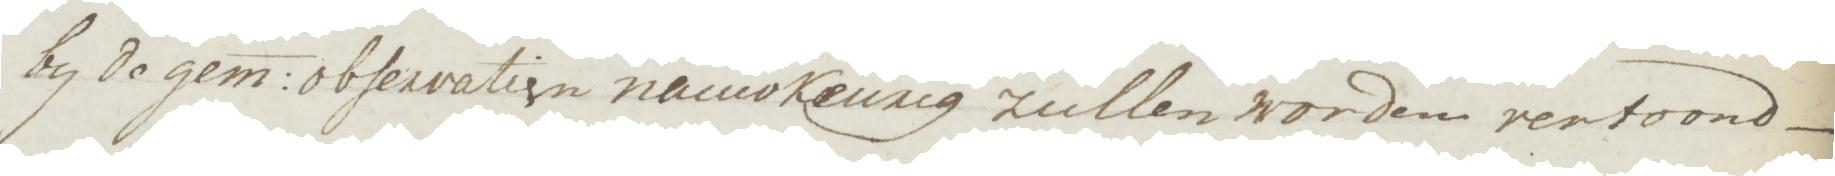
bij de gem: observatien nauwkeurig zullen worden vertoond —
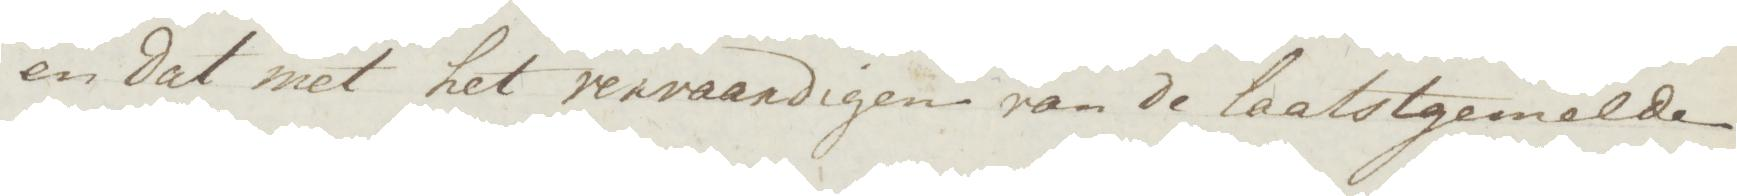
en dat met het vervaardigen van de laatstgemelde
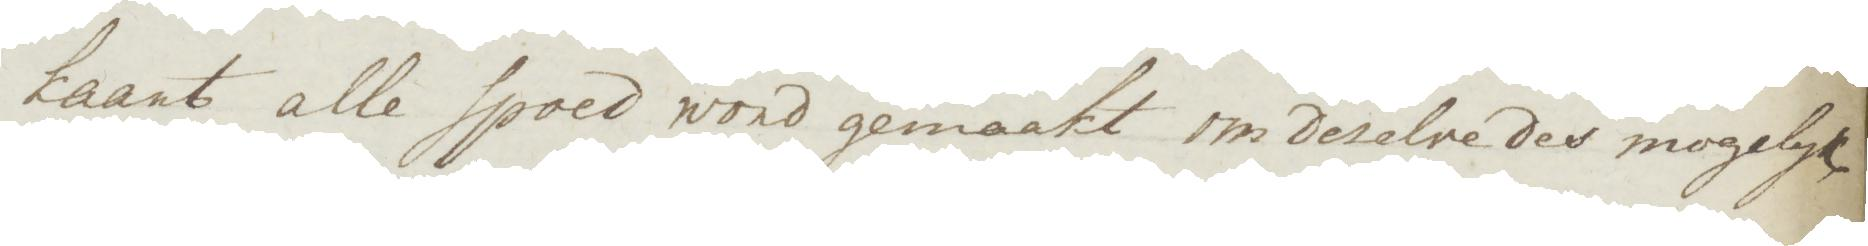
kaart alle spoed word gemaakt om dezelve des mogelyk
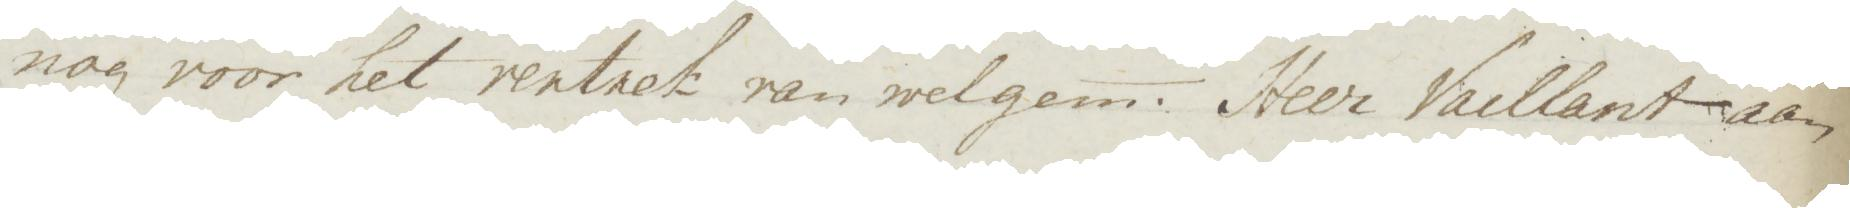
nog voor het vertrek van welgem. Heer Vaillant aan
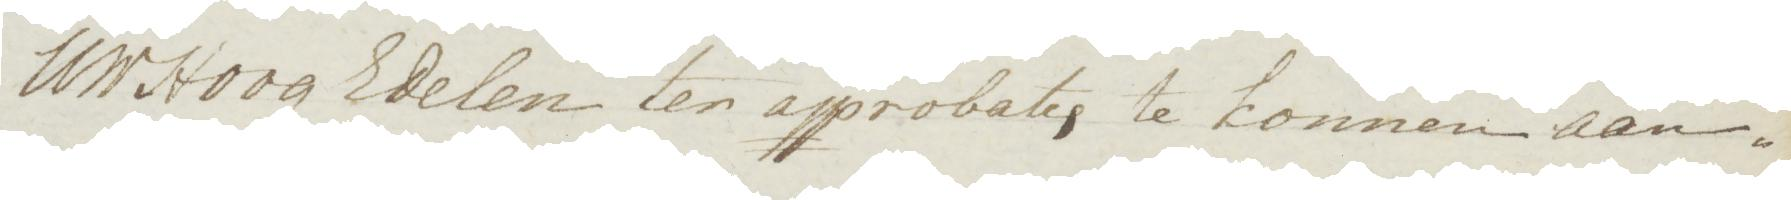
UW Hoog Edelen ter approbatie te konnen aan„
